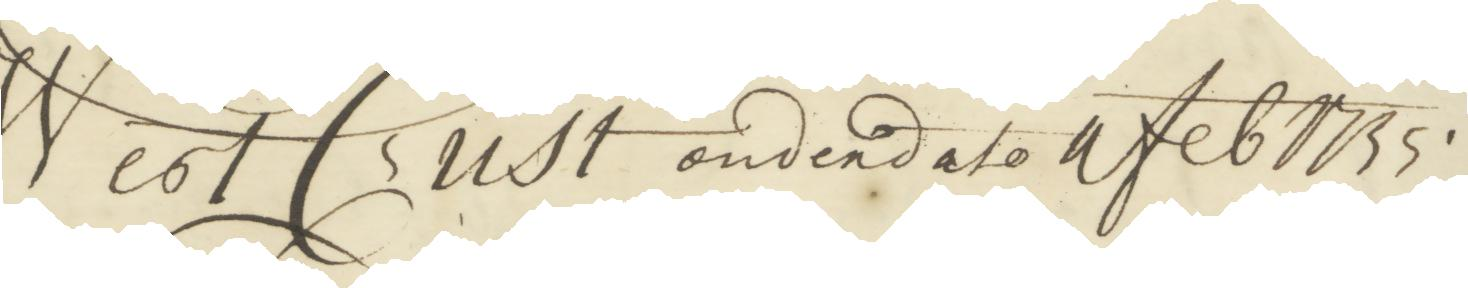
West Cust onder dato 11 feb 1735.
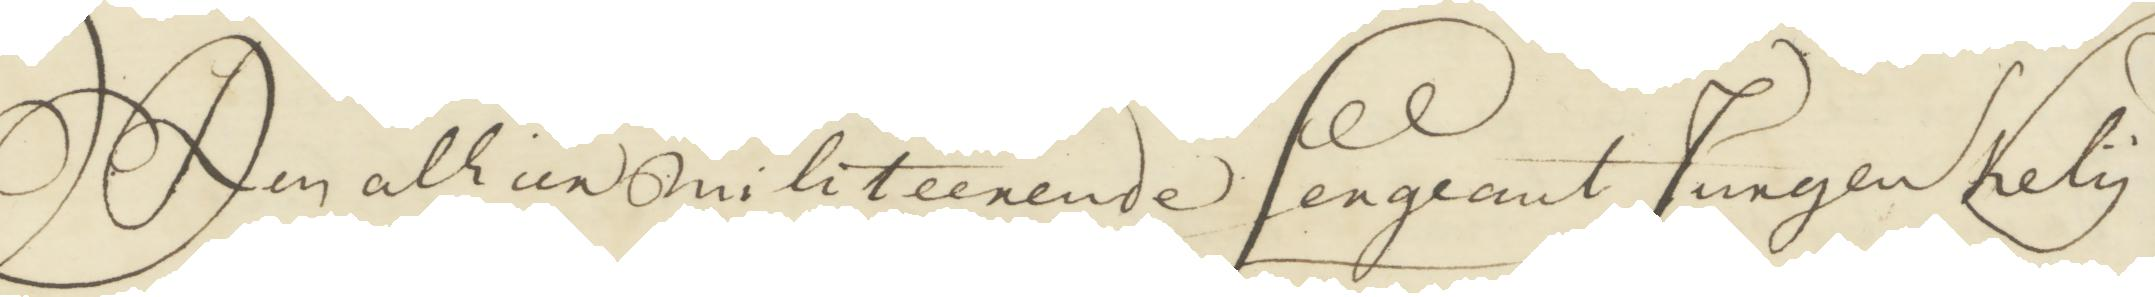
Den alhier militeerende Sergeant Jurgen Kelij
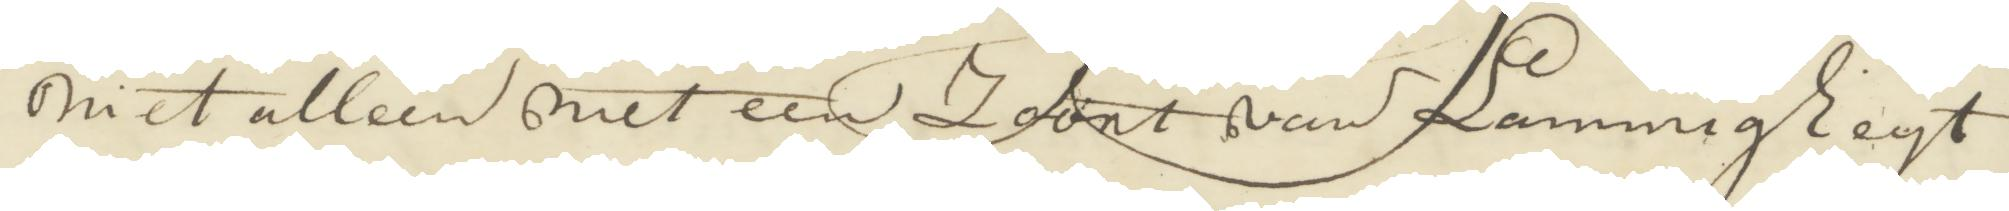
niet alleen met een zoort van lammigheijt
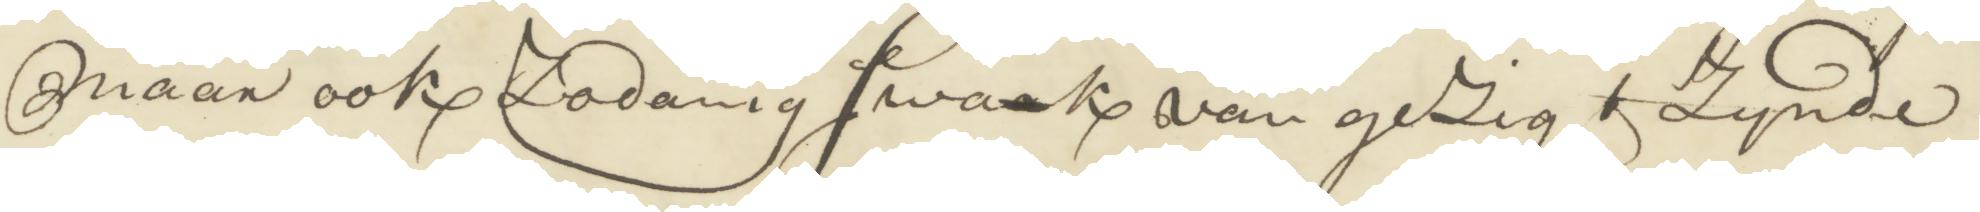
maar ook zodanig swaak van gezigt zynde
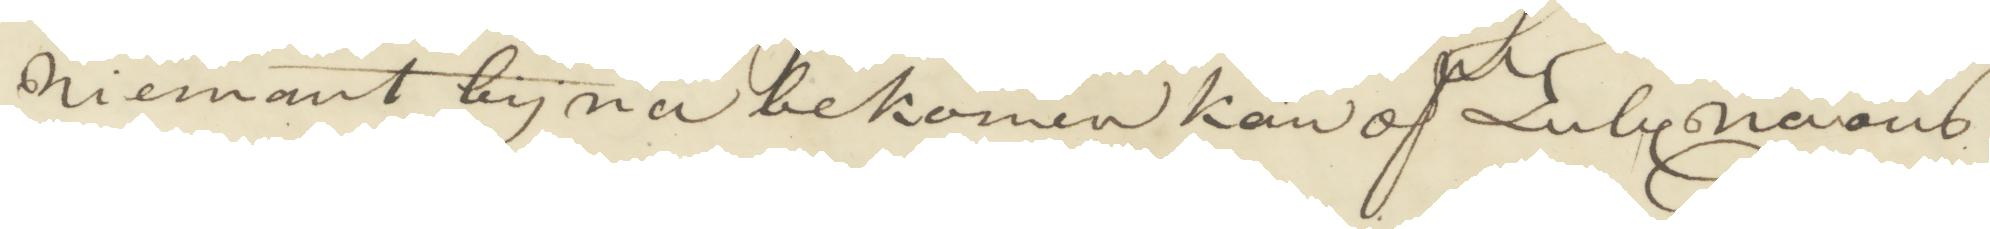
niemant bij na bekomen kan of zulx na ons
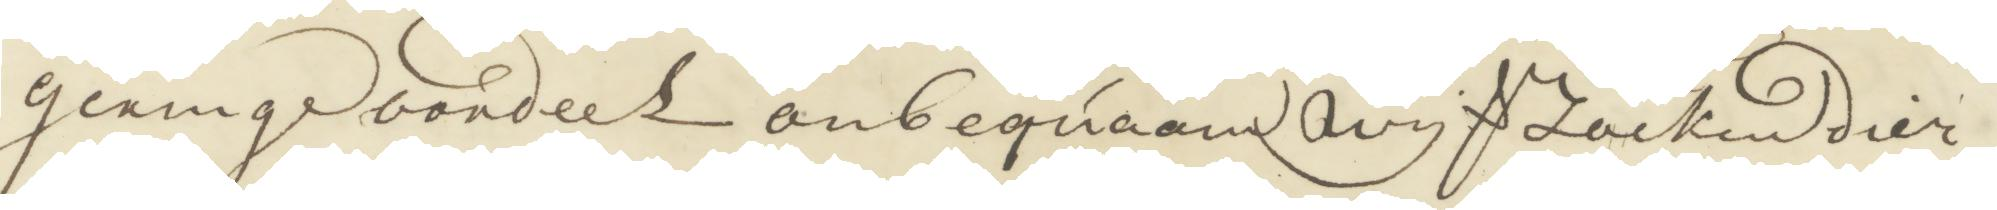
geringe oordeel onbequaam wij verzoeken dier
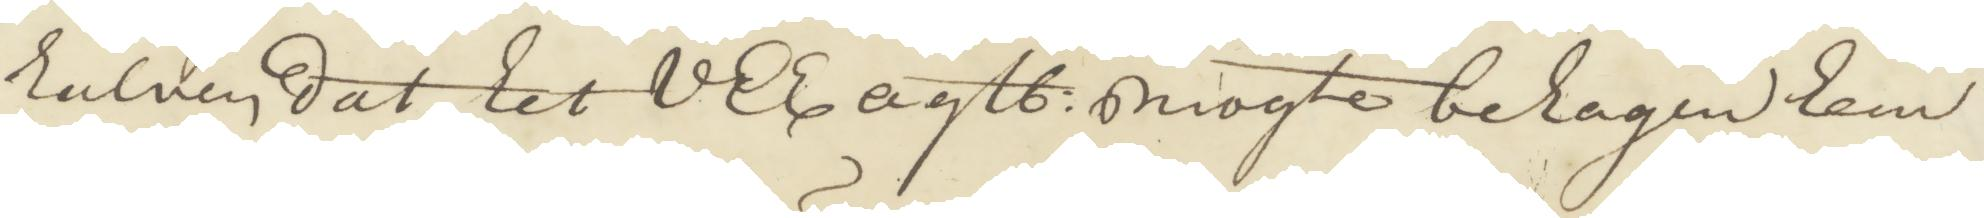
halven dat het UEE agtb: mogte behagen hem
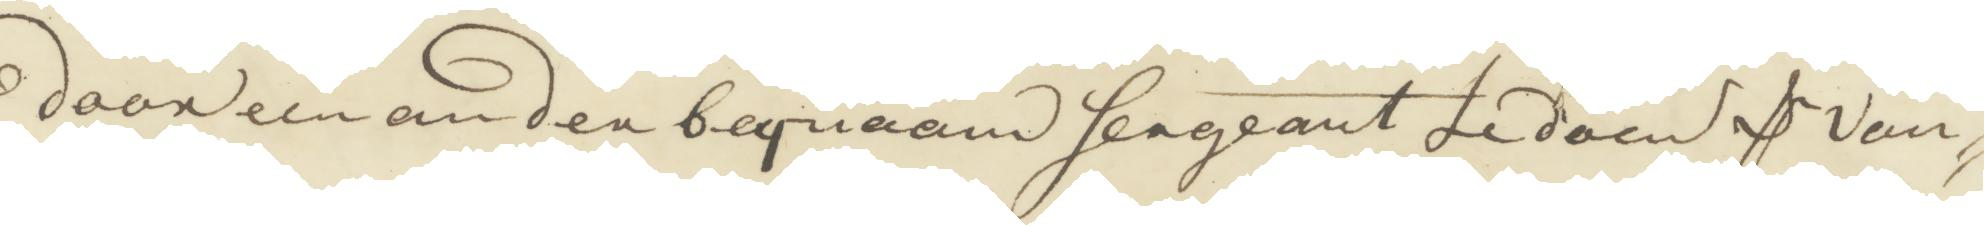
door een ander bequaam sergeant te doen vervan
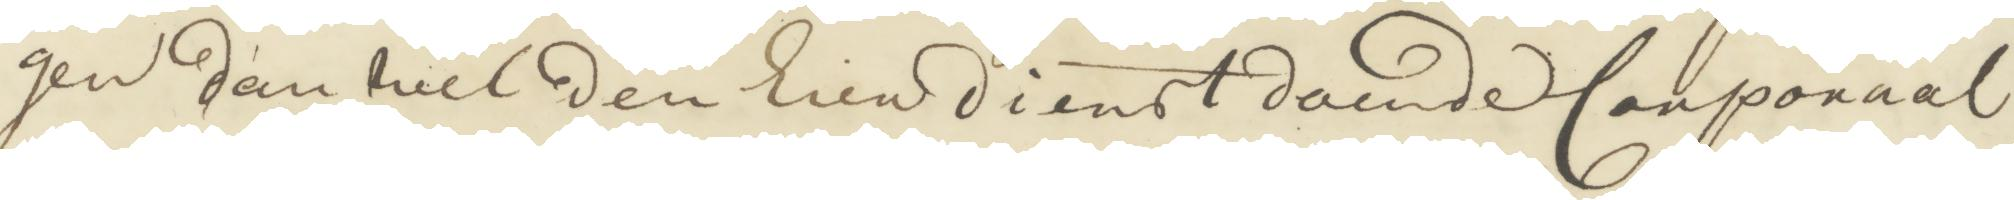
gen dan wel den hier dienst doende Corporaal
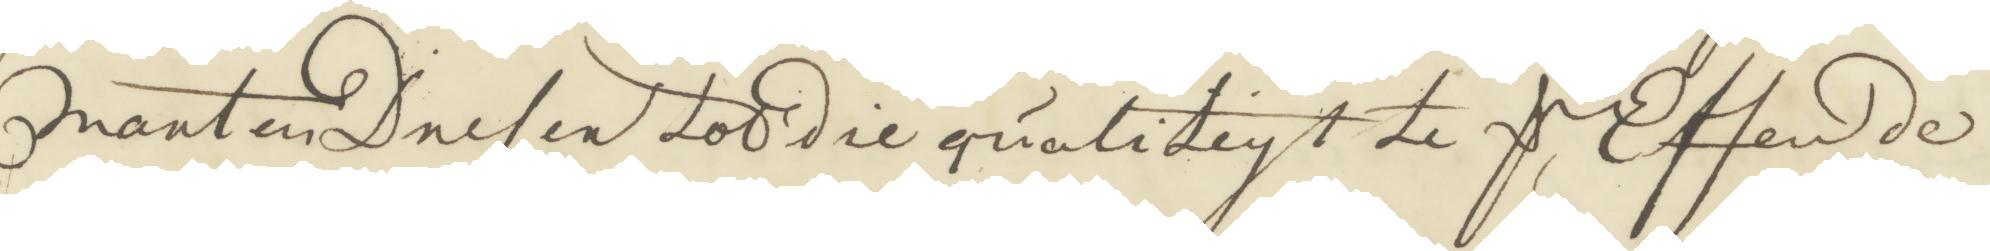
Marten Dreser tot die qualiteijt te verheffen de
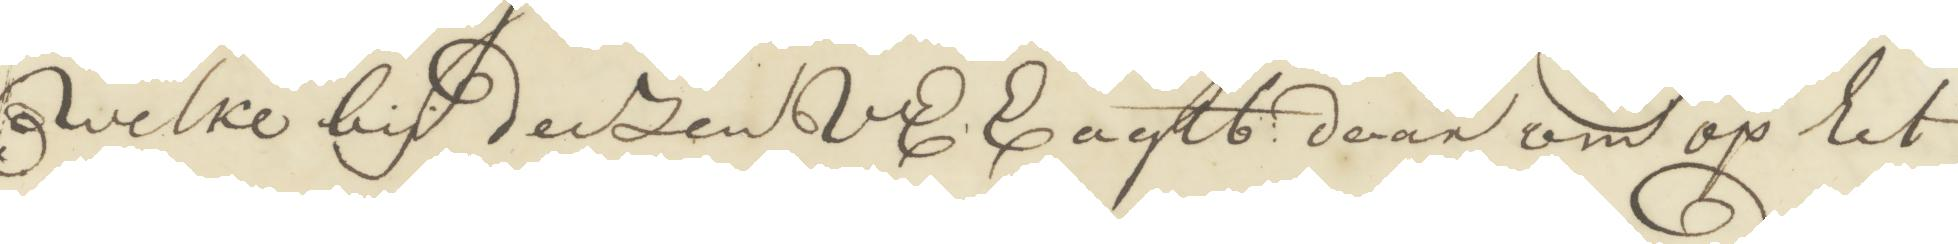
welke bij deezen UE.E agtb: daar om op het
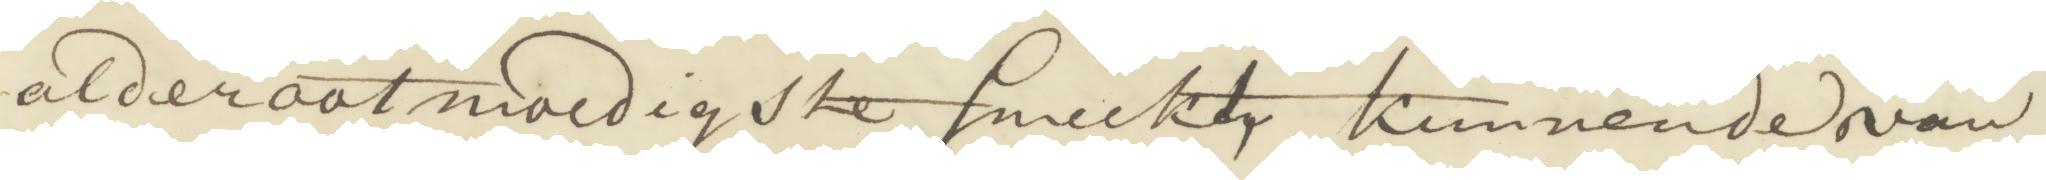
alder ootmoedigste smeekt kunnende van
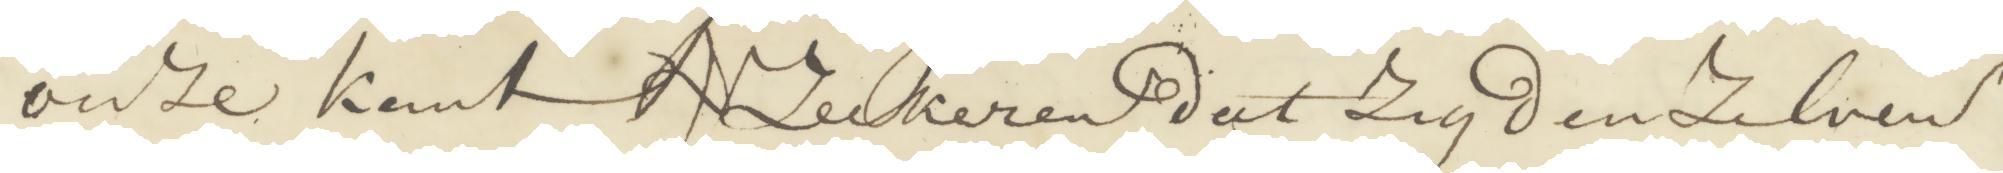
onze kant verzeekeren dat zig den zelven
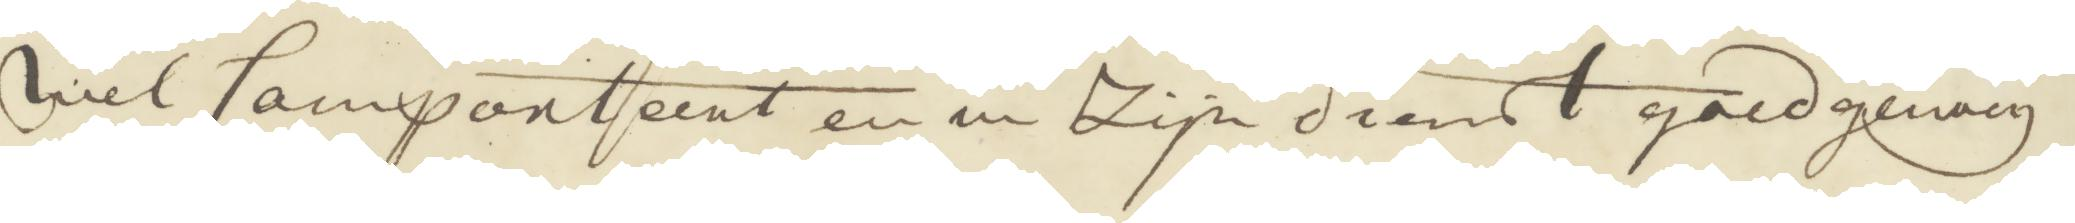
wel comporteert en in zijn dienst goed genoeg
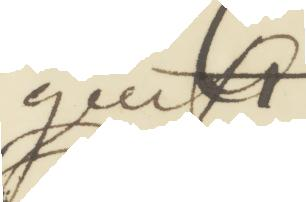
geeist
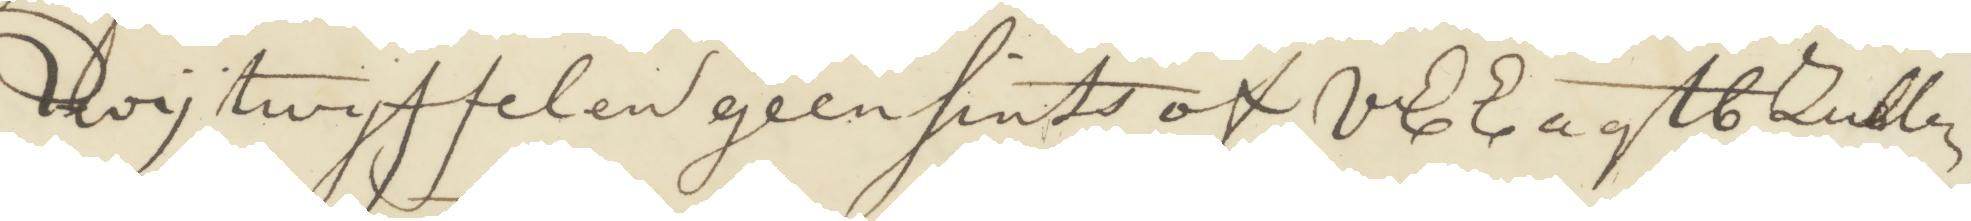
Wij twijffelen geen sints of UEE agtb zullen
